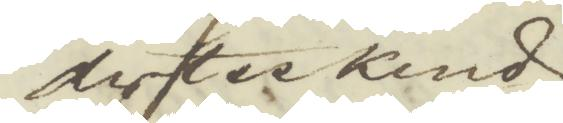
=derterkend.
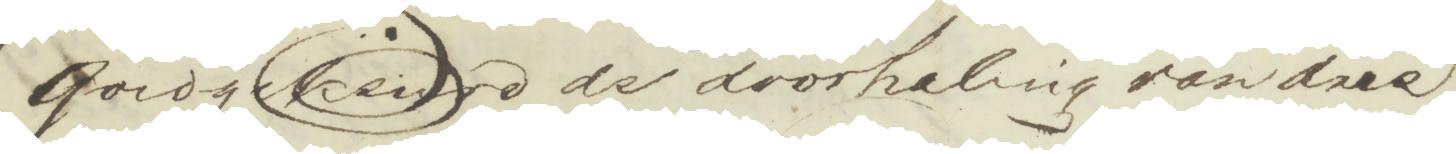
Goedgekeurd de doorhaling van drie
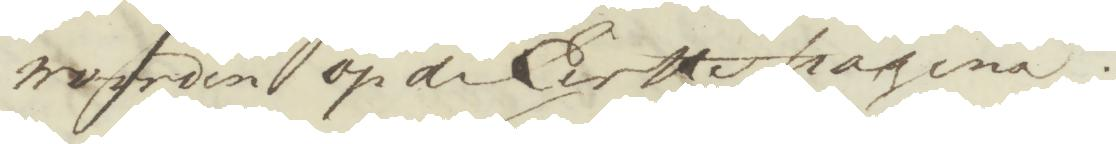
woorden op de Eerste pagina.
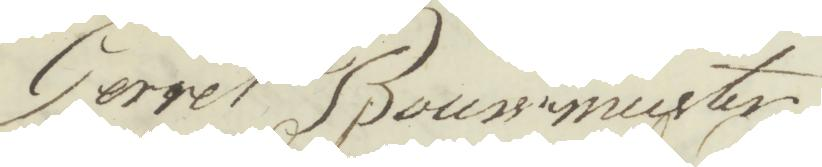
Gerret Bouwmeester
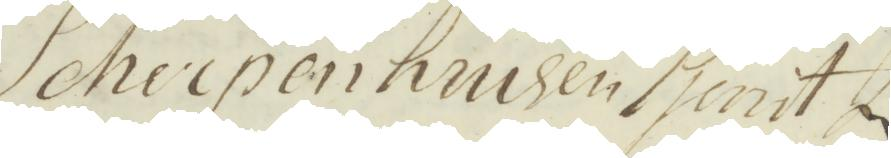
Jan Scherpenhuisen Gerritz
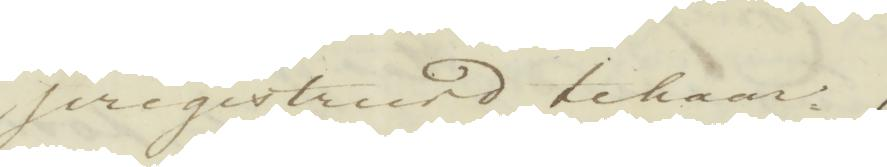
Geregistreerd te haar=
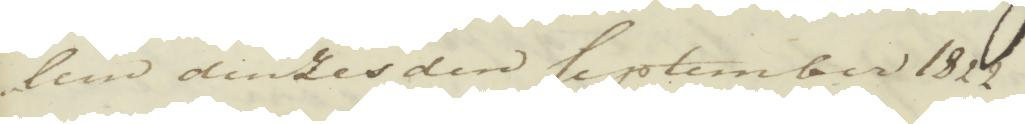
.lem den zesden september 1822
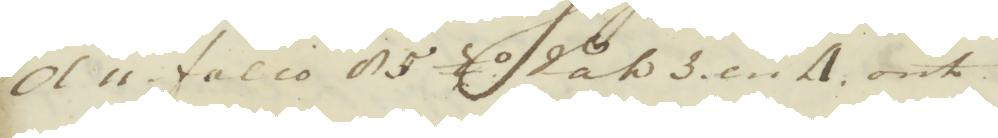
d 11. folio 85 r.o Vak 3. en 4. ont
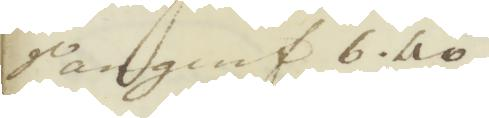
Vangen f 6.40
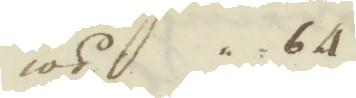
10 PC „ „ 64
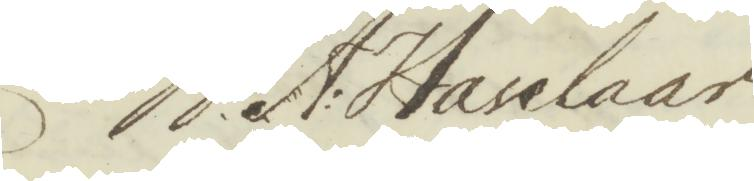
80. A: Haselaar
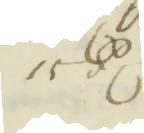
15 PC „ . 96
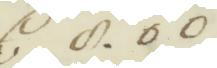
f 8. 00
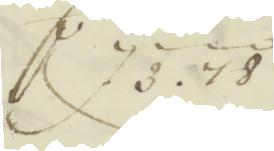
ƒ 3. 78
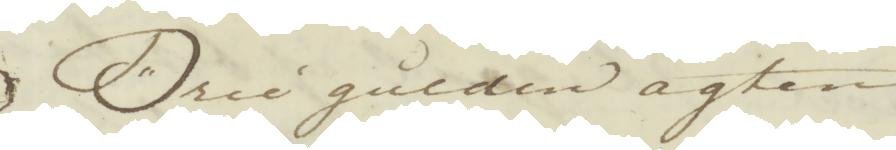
Drie gulden agten
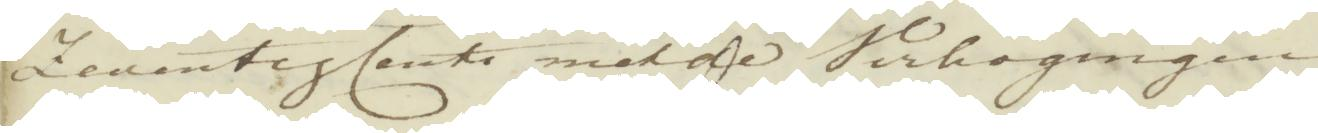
Zeventig Cents met de Verhogingen
